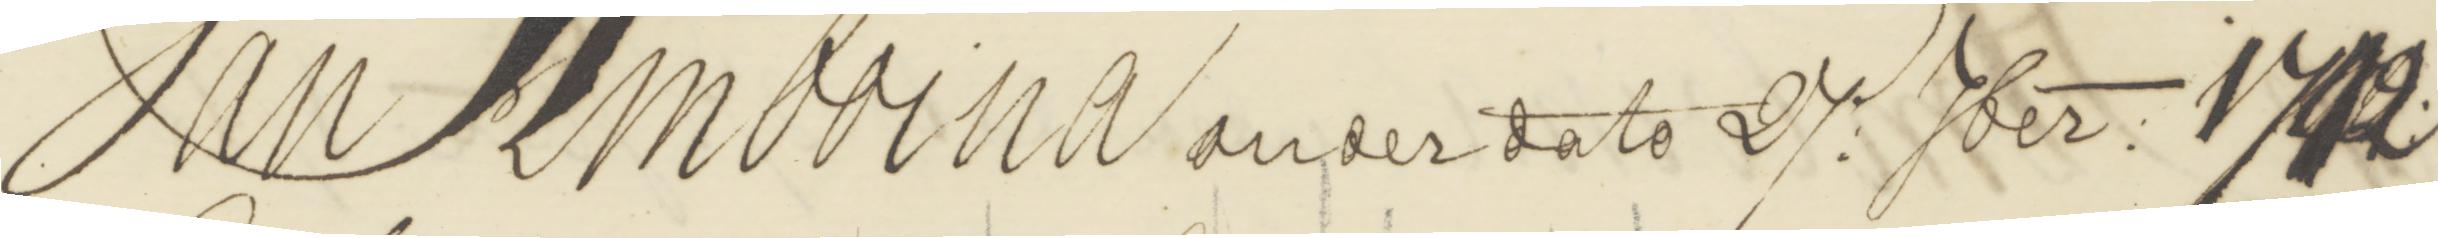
Van Amboina onder dato 27:' 7ber: 1742:
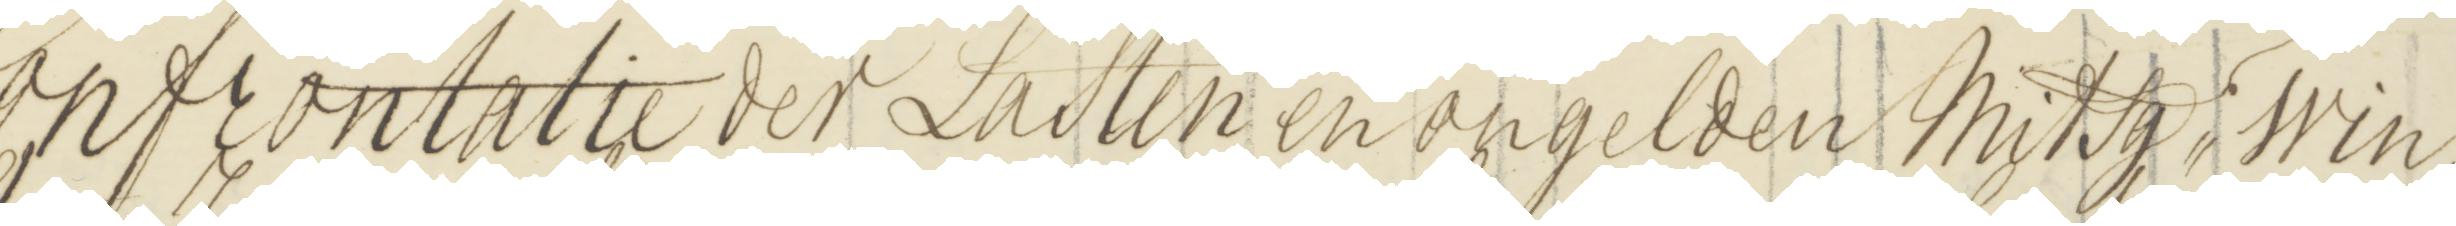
nfrontatie der Lasten en ongelden Mitsg„s win
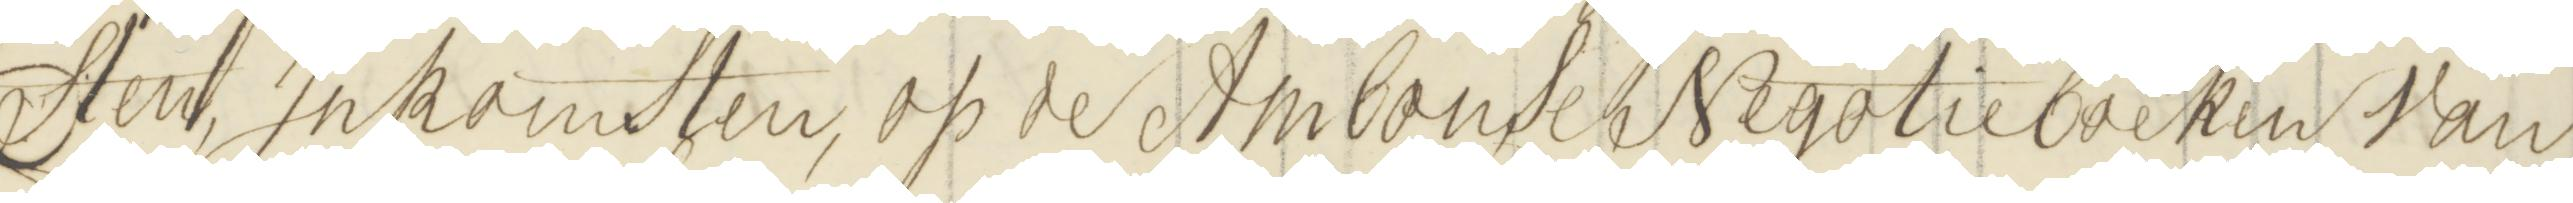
sten, Jnkomsten, op de Ambonse Negotieboeken van
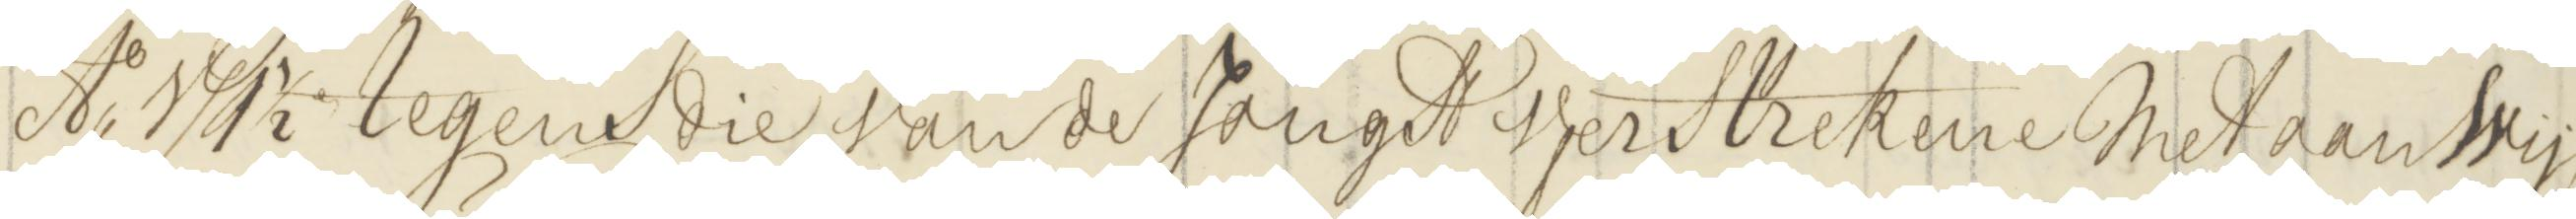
A„o 1741/2 tegens die van de Jongst verstrekene met aanwij
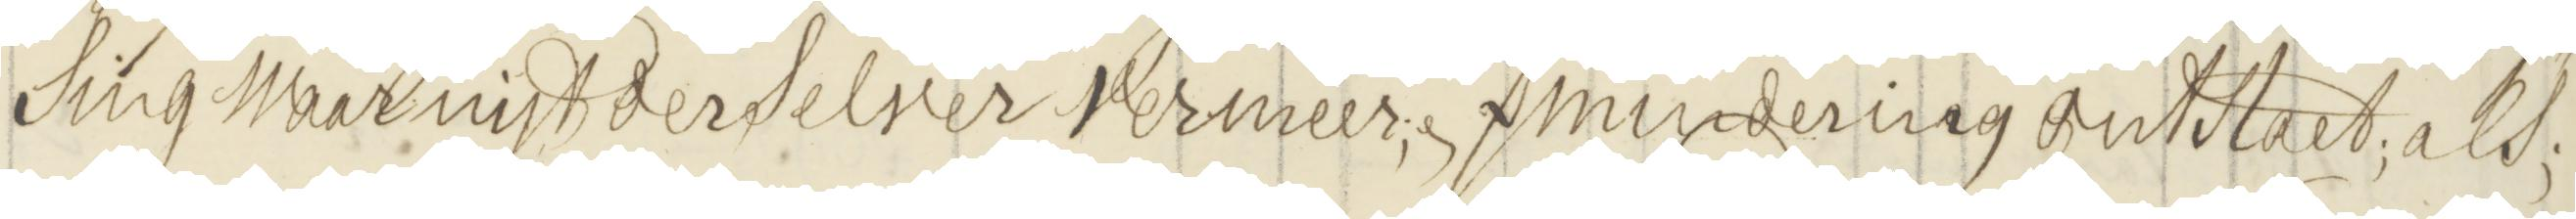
sing waar uijt derselver vermeer; en vermindering ontstaet; als;
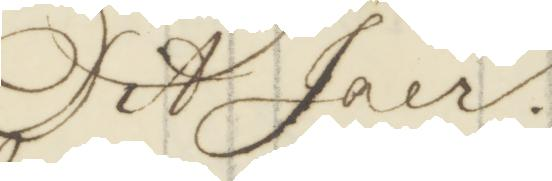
Dit Jaer
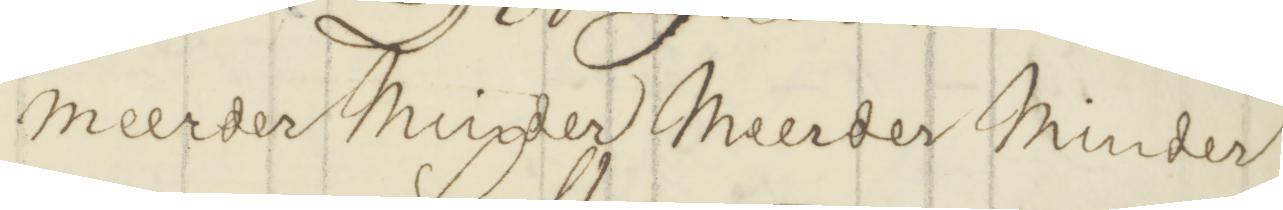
meerder minder meerder minder
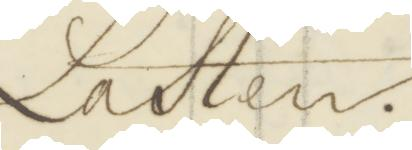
Lasten.
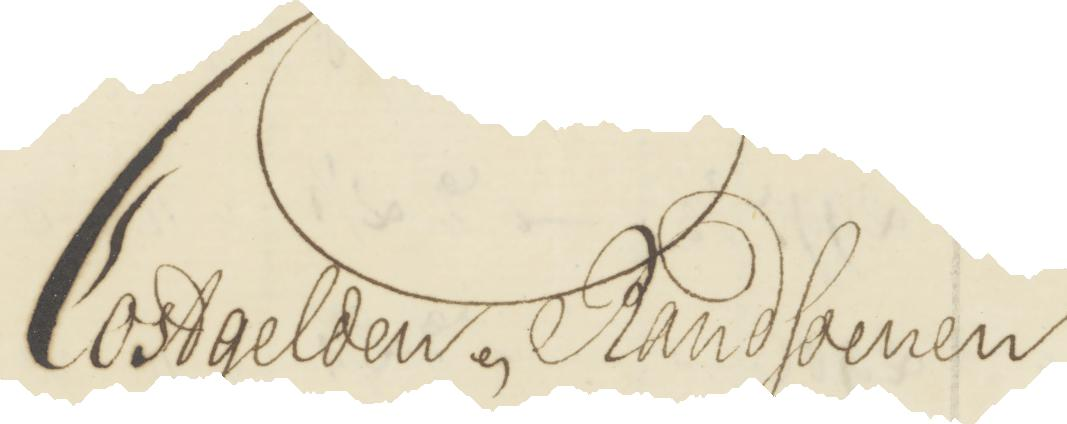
Costgelden en Randsoenen
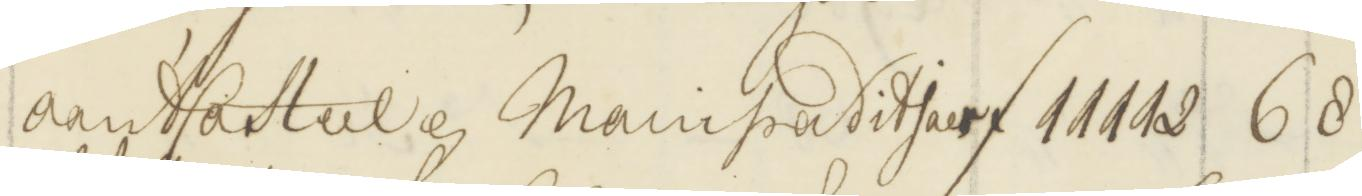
aan 't Casteel en mainpa ditjaer ƒ 44442 6 8
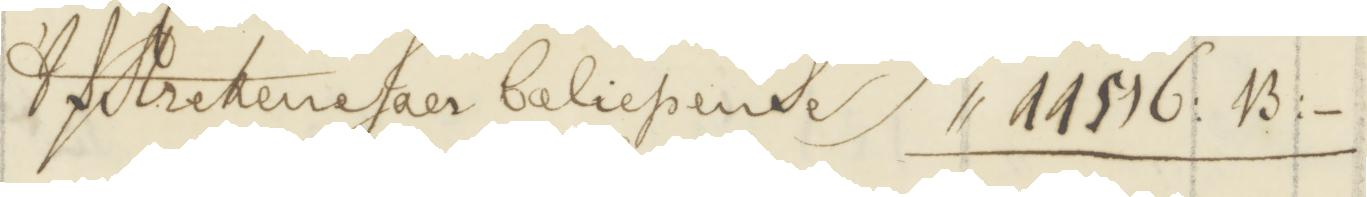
't verstrekene Jaer baliepense „ 44516: 13: -
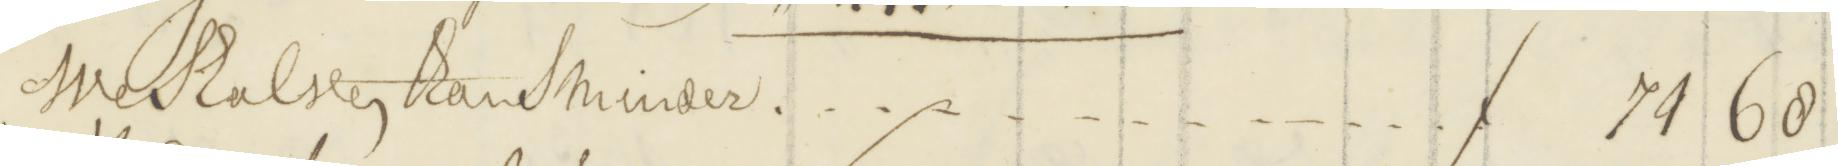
weshalven thans minder - - - - - - - - - - - - - ƒ 74 6 8
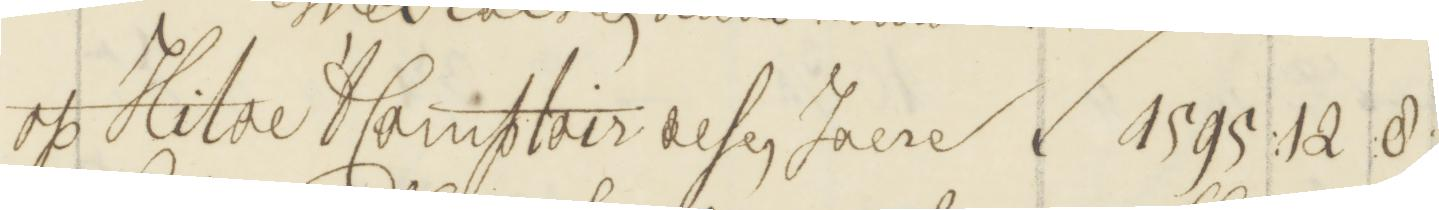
op Hitoe 'tComptoir desen Jaere ƒ 4595 :12 :8
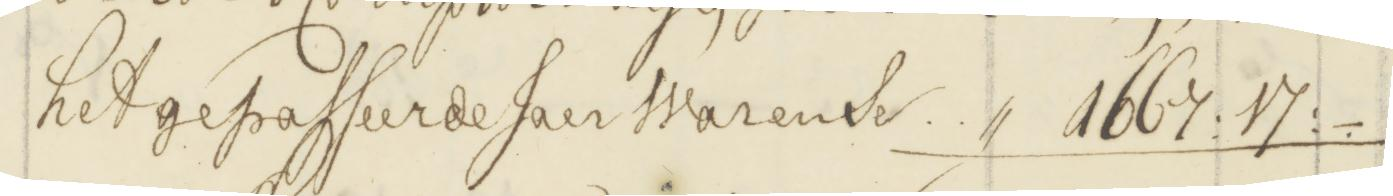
het gepasseerde Jaer warense . . „ 4667: 17: —
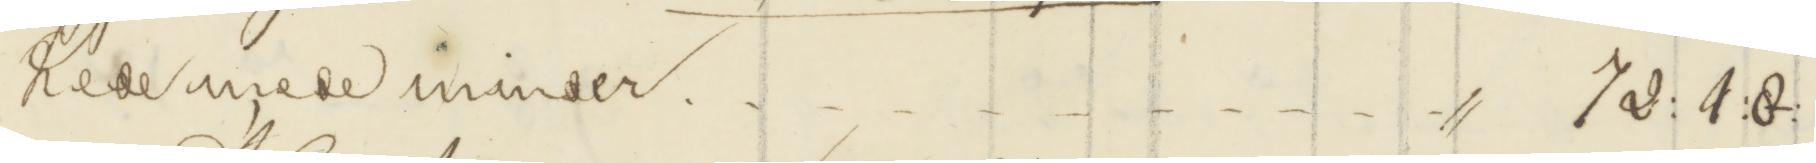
Rede mede minder - - - - - - - - - - - „ 72: 4: 8:
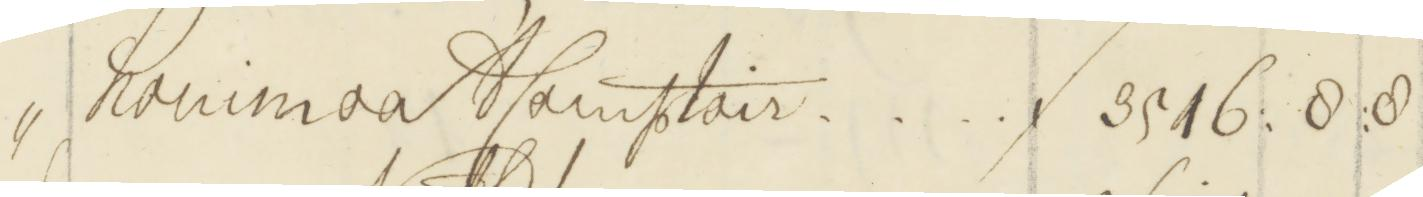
„ honimoa 'tComptoir - - - - ƒ 3546: 8 :8
